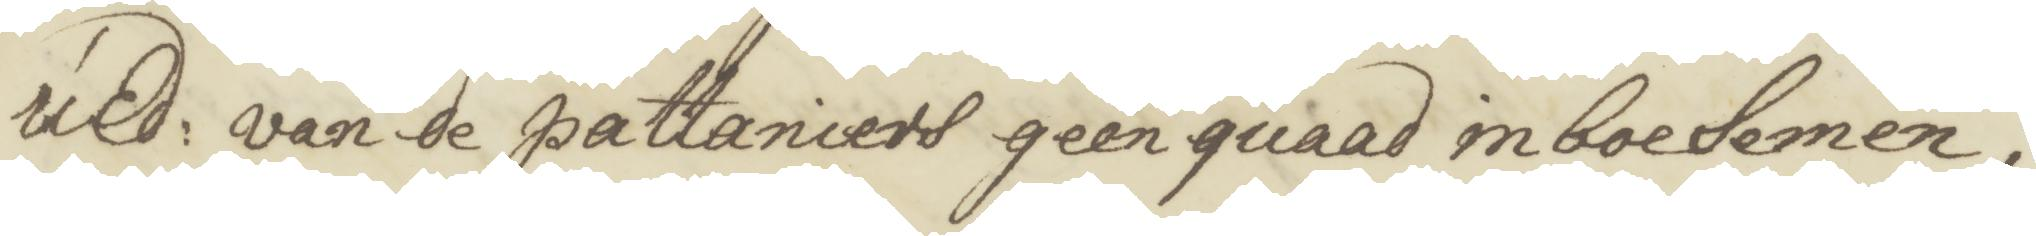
uEd: van de pattaniers geen quaad in boesemen,
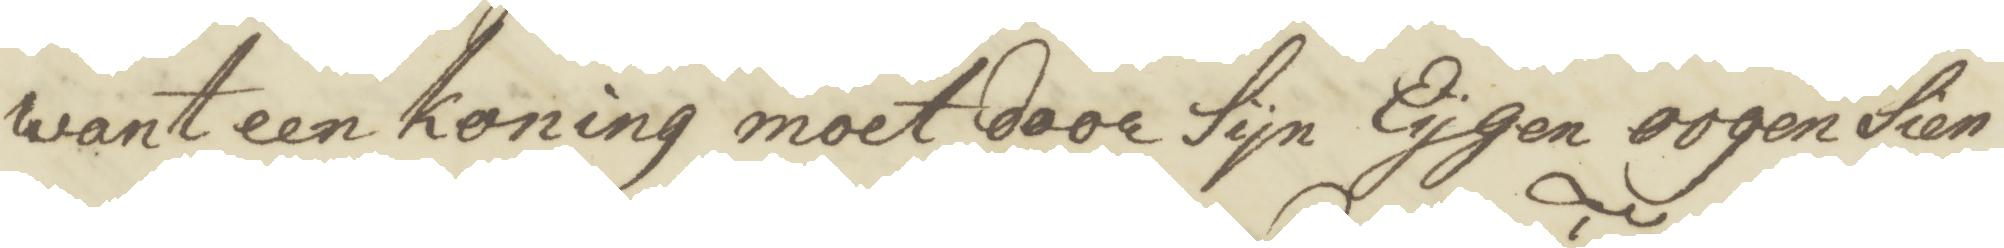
want een koning moet door sijn Eijgen oogen sien
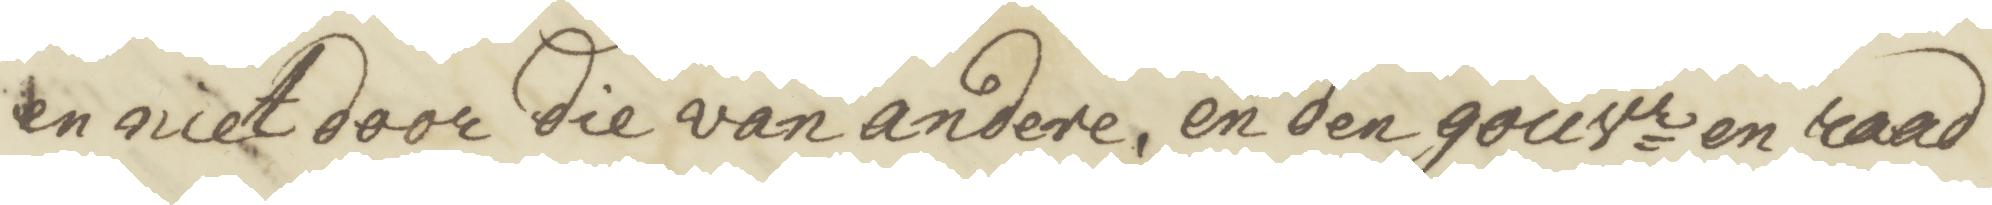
en niet door die van andere, en den gouv=r en raad
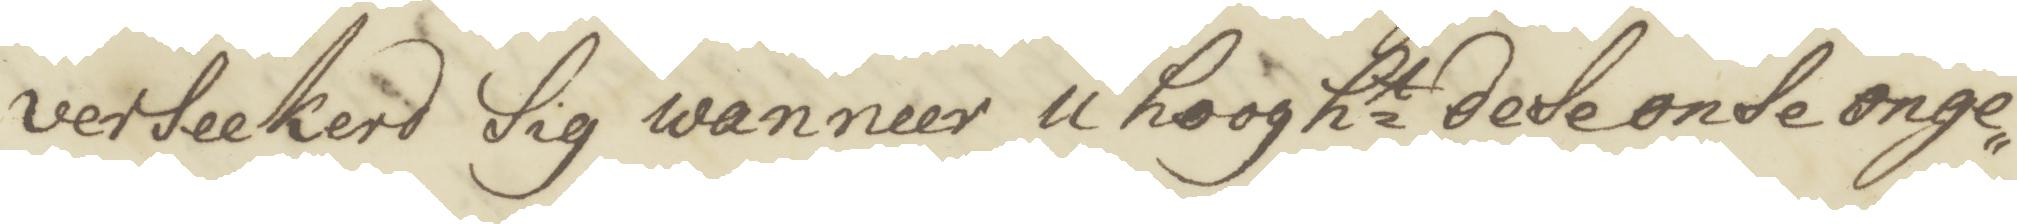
verseekerd sig wanneer u hoogh=t dese onse onge„
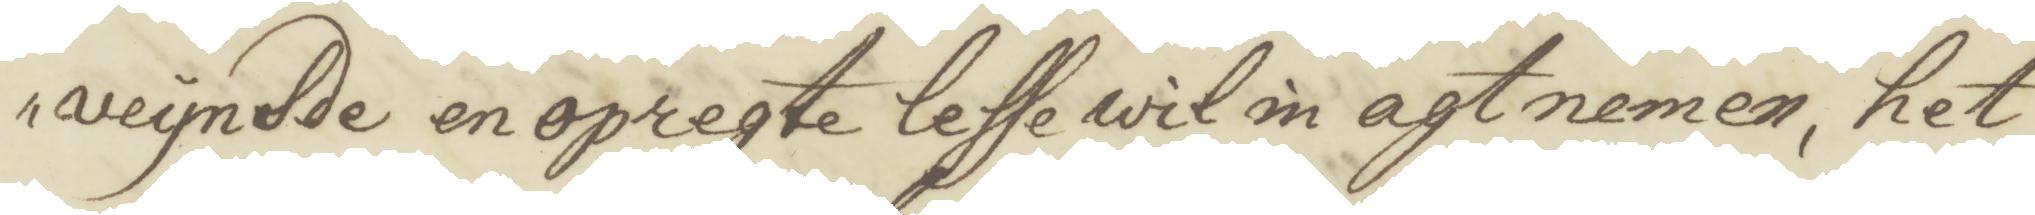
„veijnsde en opregte lesse wil in agt nemen, het
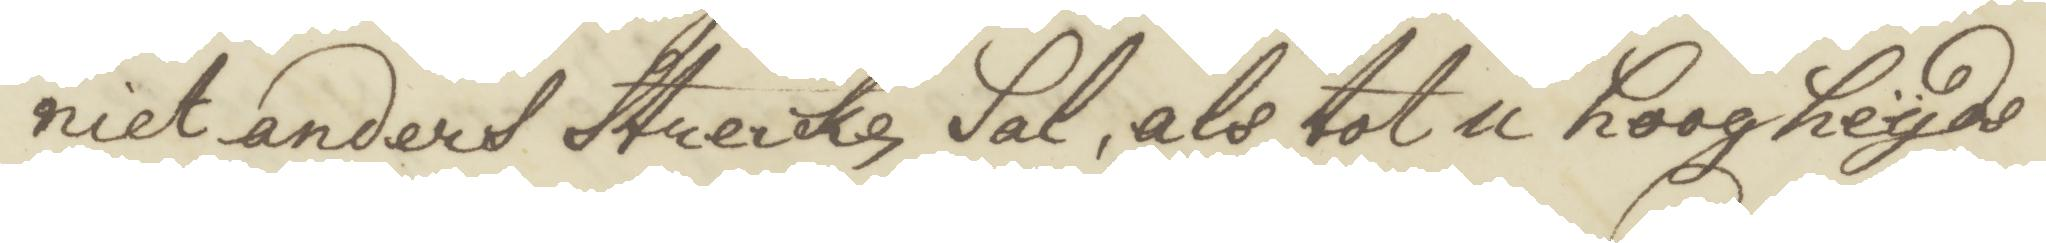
niet anders strecken sal, als tot u hoogheijds
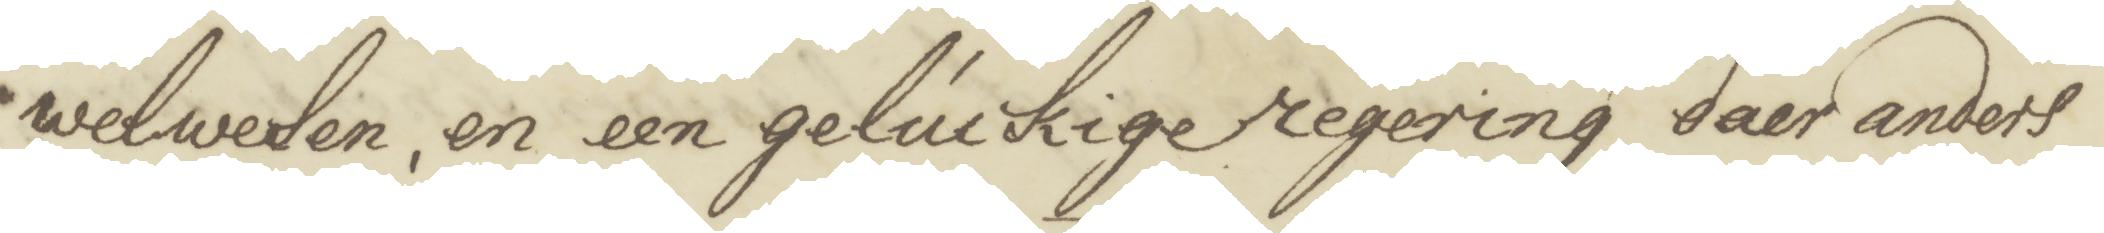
welwesen, en een geluckige regering daer anders
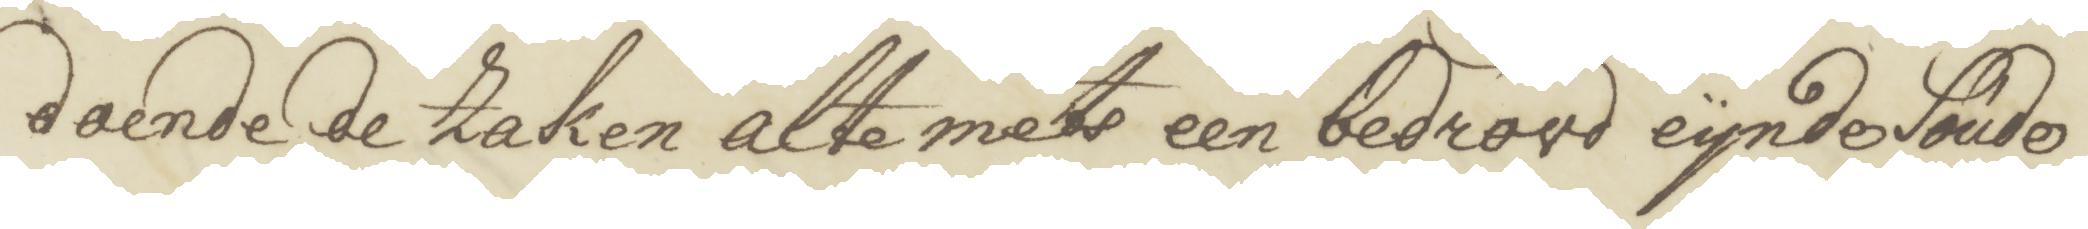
doende de zaken alte mets een bedrovd eijnde soude
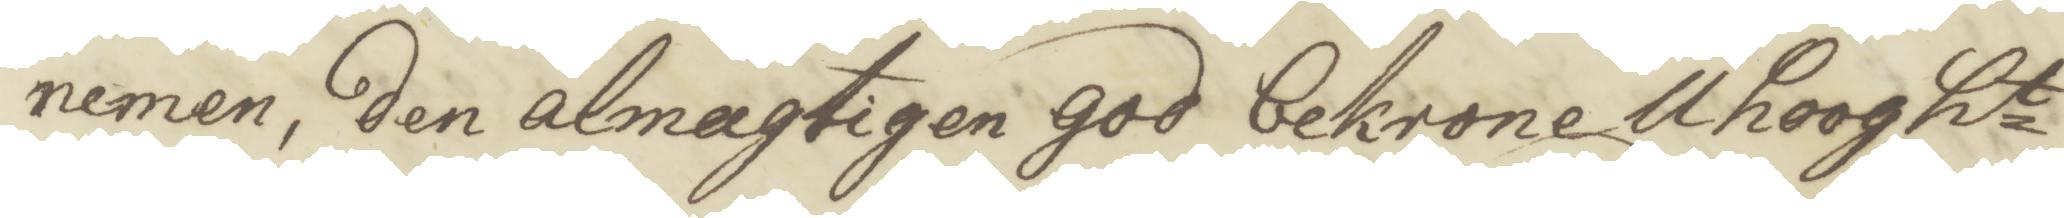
nemen, den almagtigen god bekrone U hoogh=t
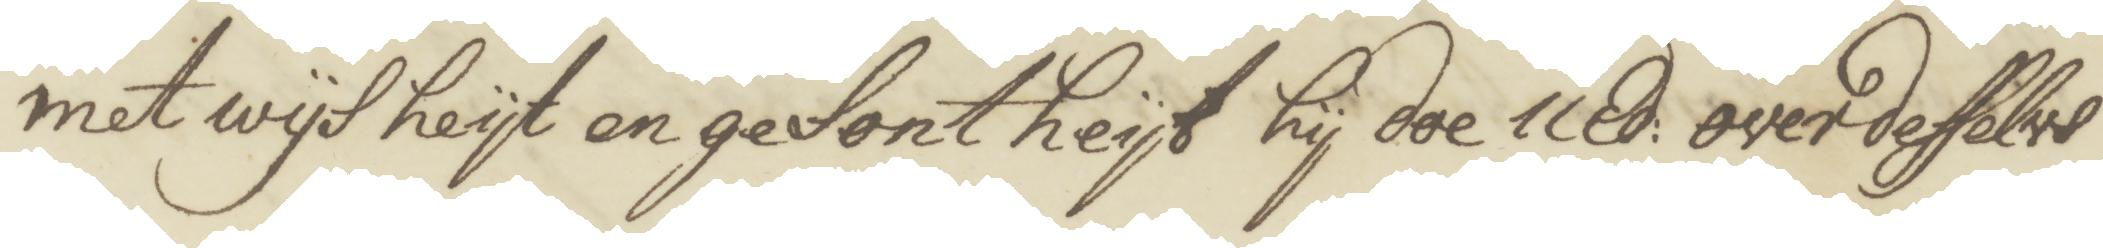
met wijsheijt en gesontheijt hij doe uEd: over desselvs
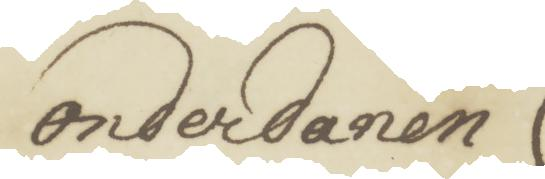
onderdanen
